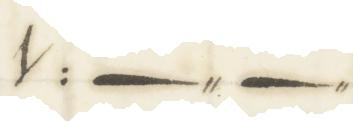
1: —„ —„
